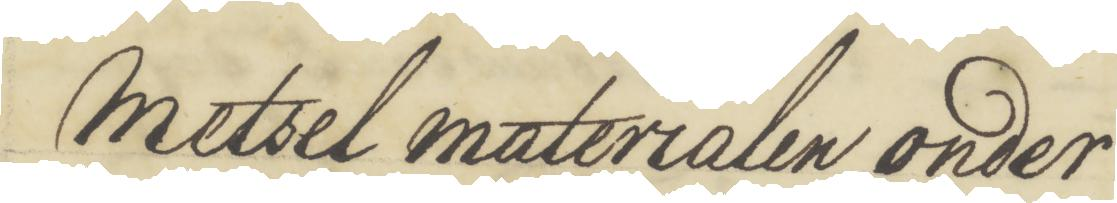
metsel materialen onder
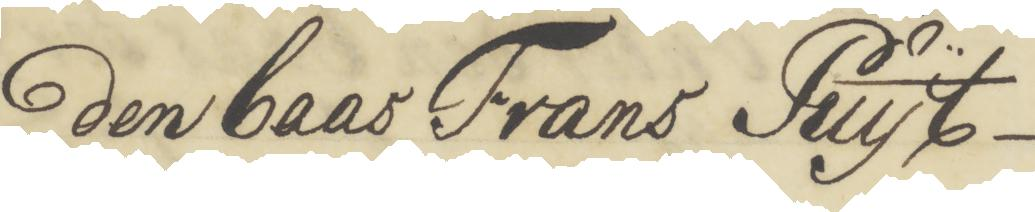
den baas Frans Puijt
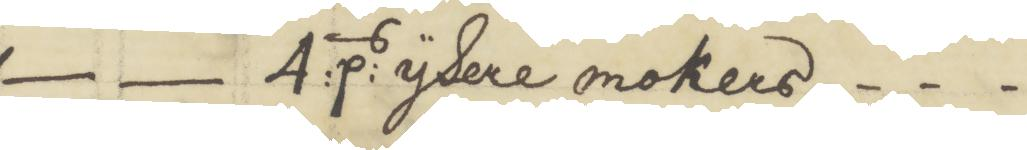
— — 4:p:s ijsere mokers - - -
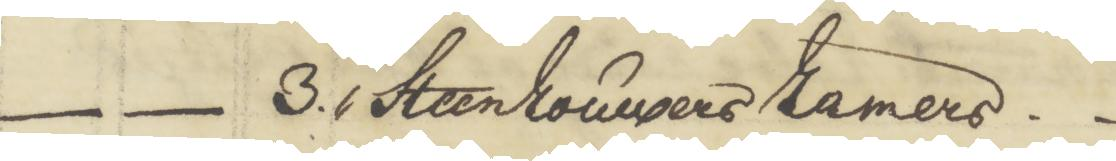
— — 3.„ steenhouwers hamers - -
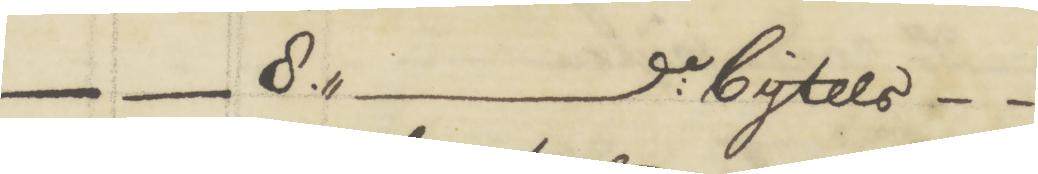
— — 8.„ _:o bijtels - -
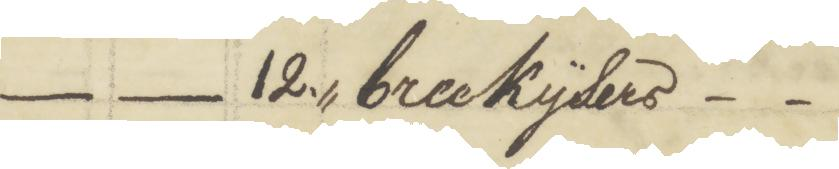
— — 12.„ breekijsers - -
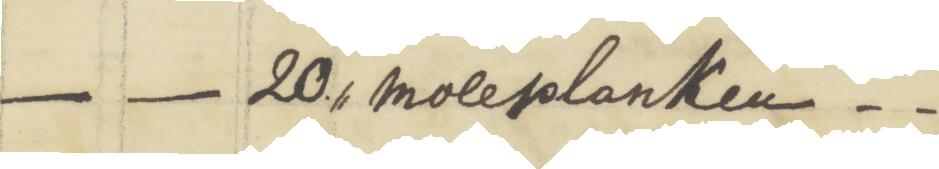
— — 20.„ moleplanken - -
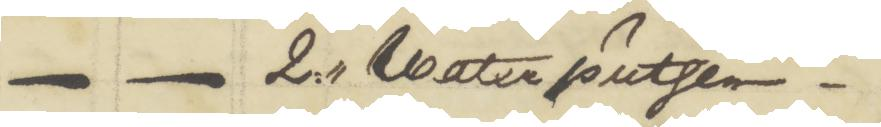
— — 2:„ waterputsen -
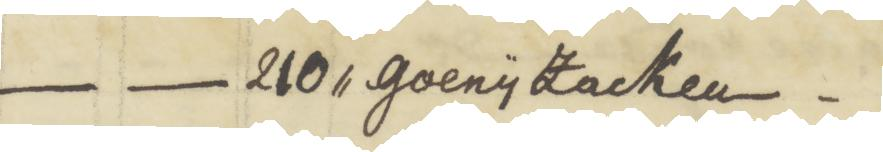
— — 210„ goenij zacken -
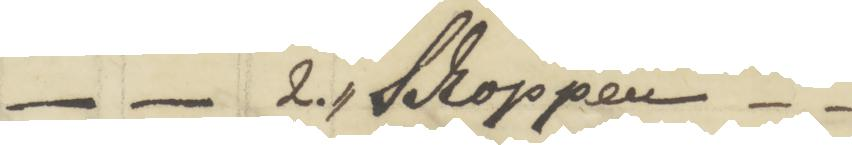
— — 2.„ schoppen - -
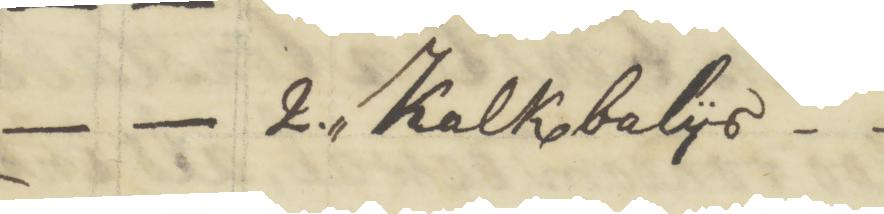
— — 2.„ Kalkbalijs - -
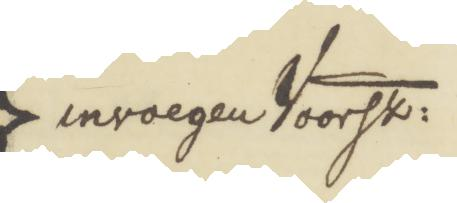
> invoegen Voorsz:
